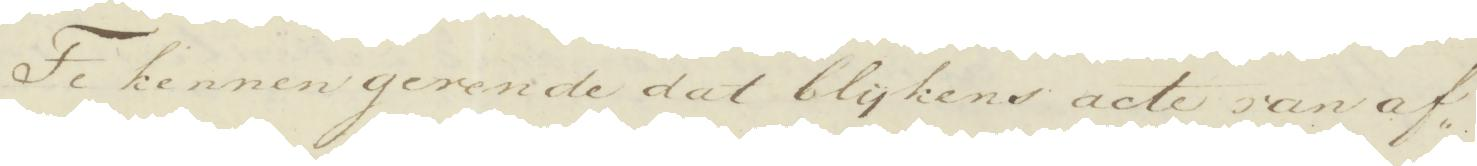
Te kennen gevende dat blijkens acte van af„
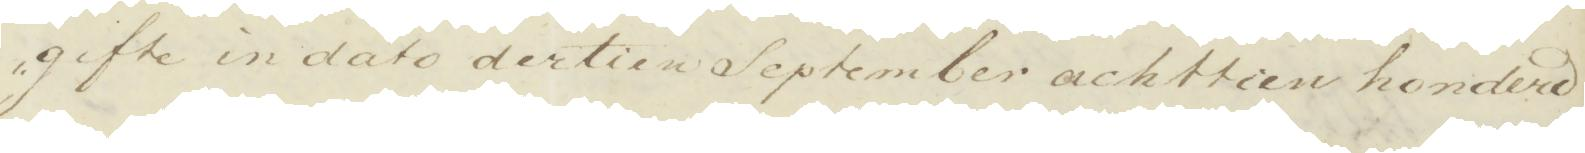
„gifte in dato dertien September achttien honderd
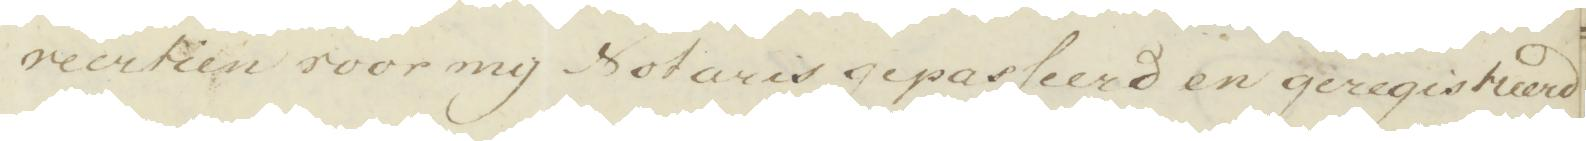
veertien voor mij Notaris gepasseerd en geregistreerd
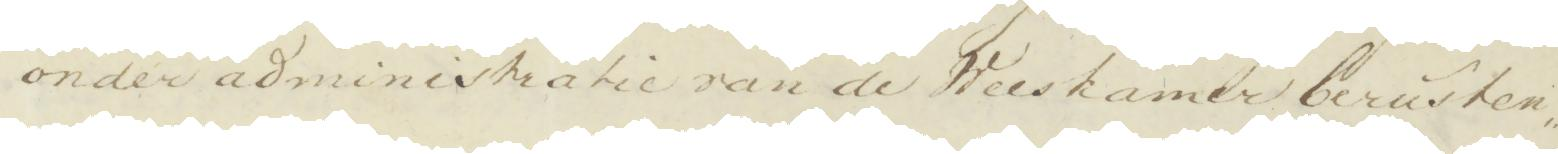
onder administratie van de Weeskamer berusten
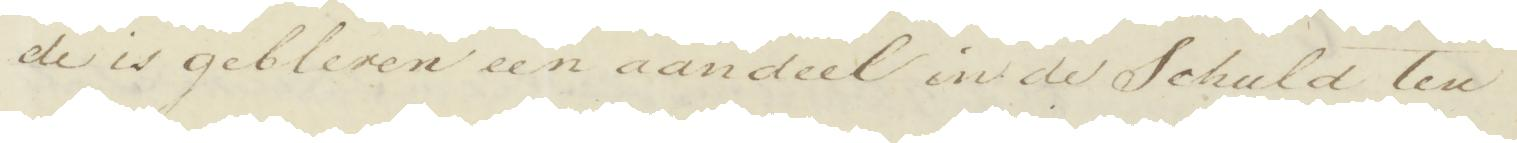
de is gebleven een aandeel in de Schuld ten
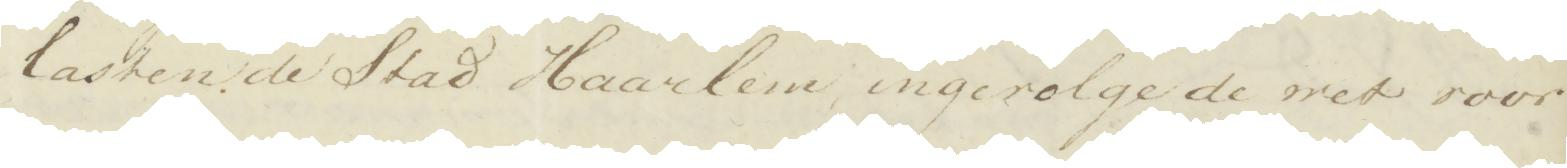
lasten de Stad Haarlem, ingevolge de wet voor
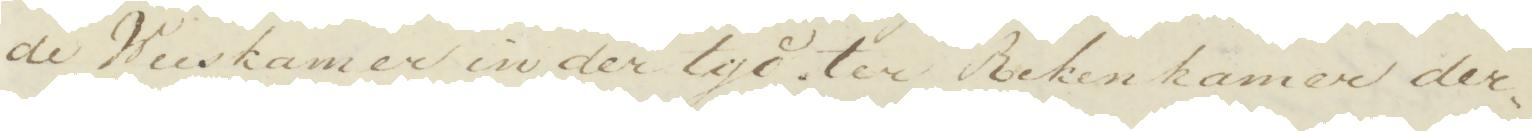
de Weeskamer in der tijd ter Rekenkamer der„
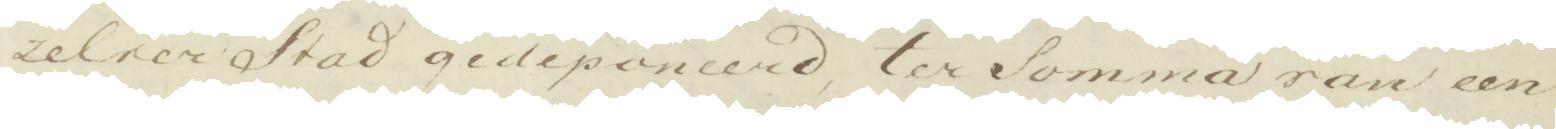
zelver Stad gedeponeerd, ter somma van een
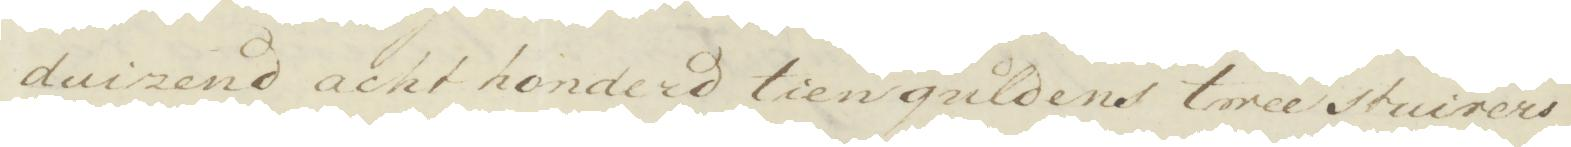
duizend acht honderd tien guldens twee stuivers
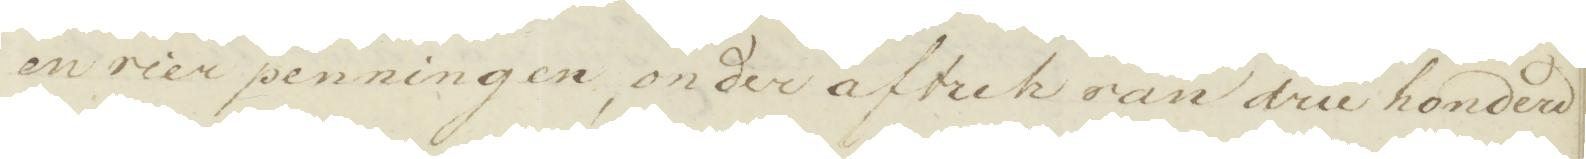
en vier penningen, onder aftrek van drie honderd
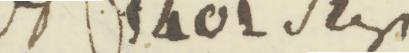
Nr 1401 Reg
